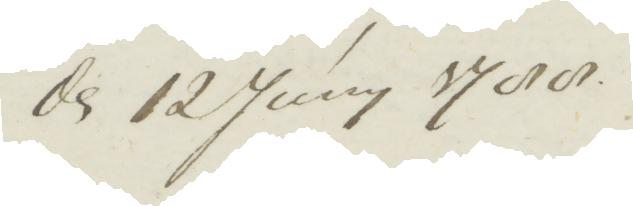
den 12 Juny 1788.
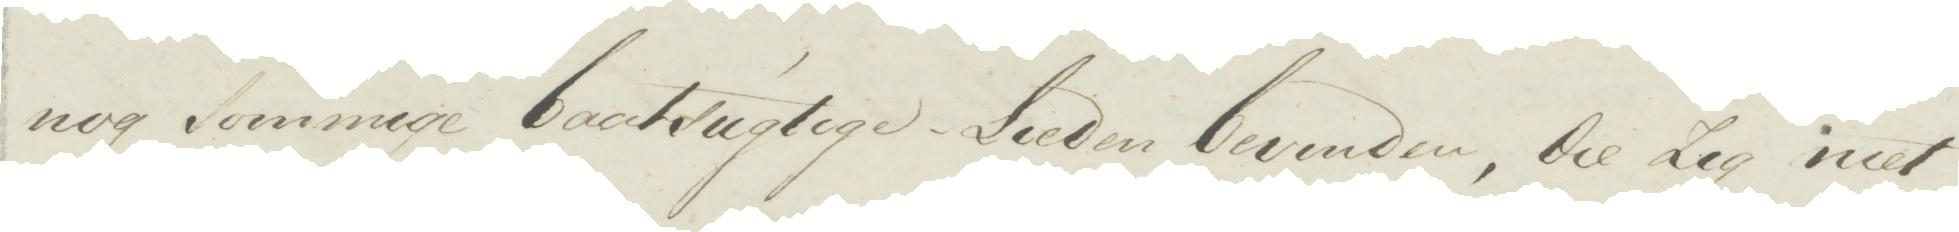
nog sommige baatsugtige - Lieden bevinden, die zig niet
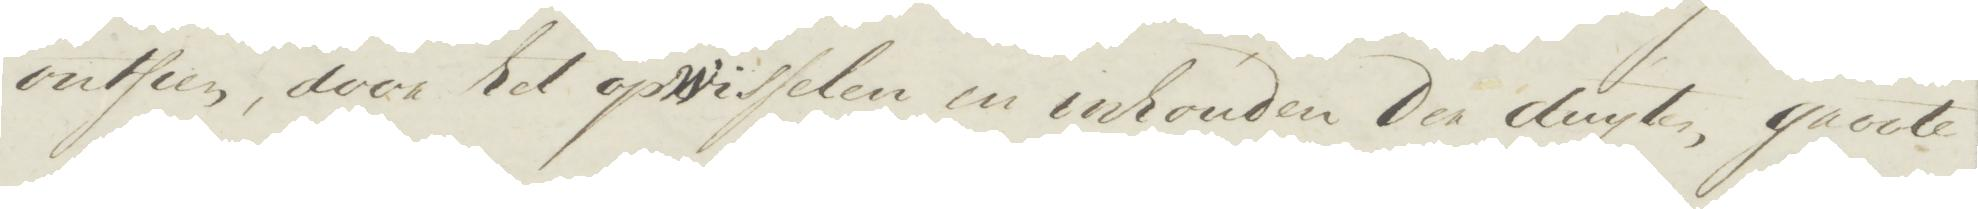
ontsien, door het opwisselen en inhouden der duyten groote
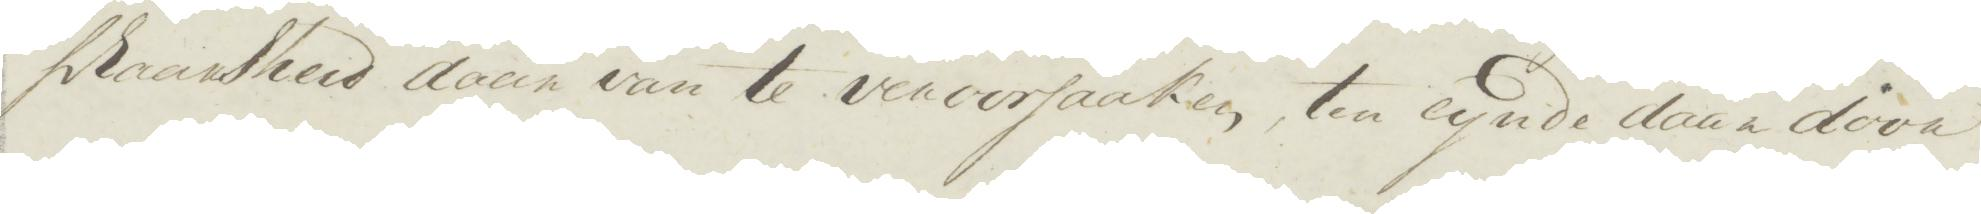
schaarsheid daar van te veroorsaaken, ten eynde daar door
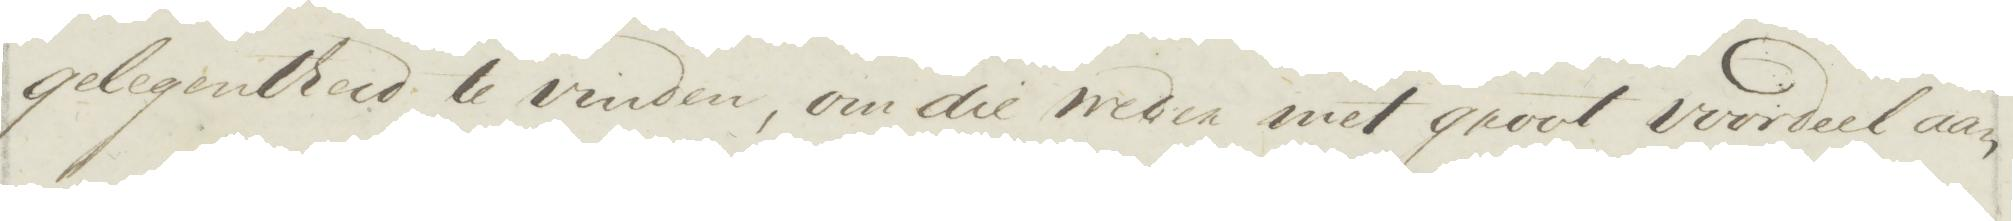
gelegentheid te vinden, om die weder met groot voordeel aan
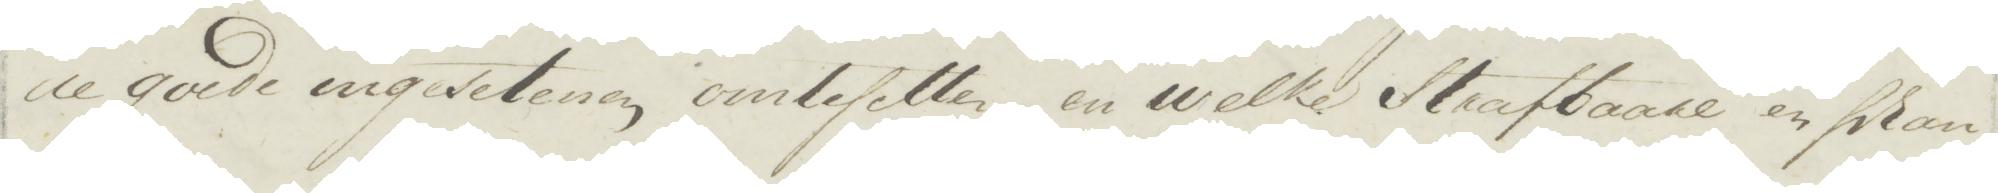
de goede ingesetenen omtesetten, en welke strafbaare en schan,
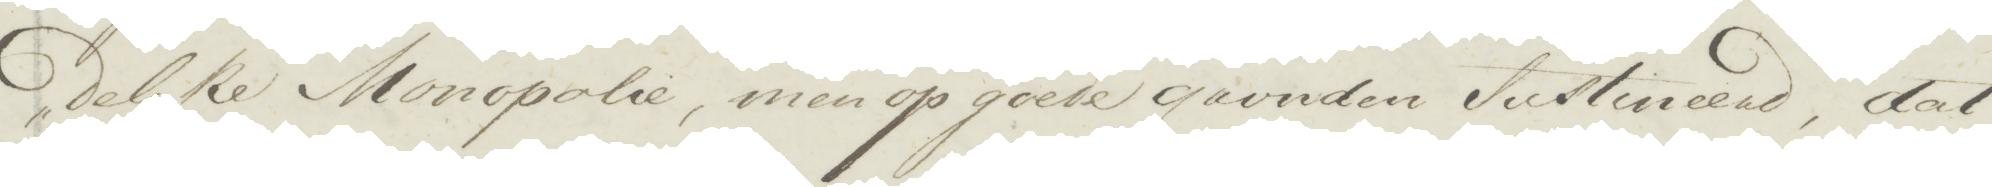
„delyke Monopolie, men op goede gronden sustineerd, dat
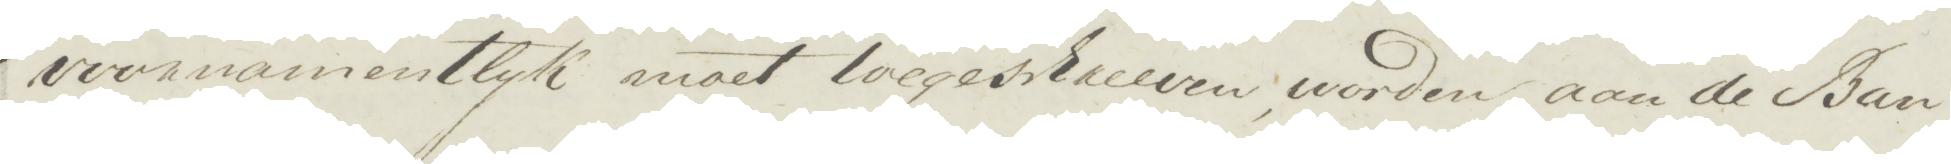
voornamentlyk moet toegeschreeven, worden, aan de Ban
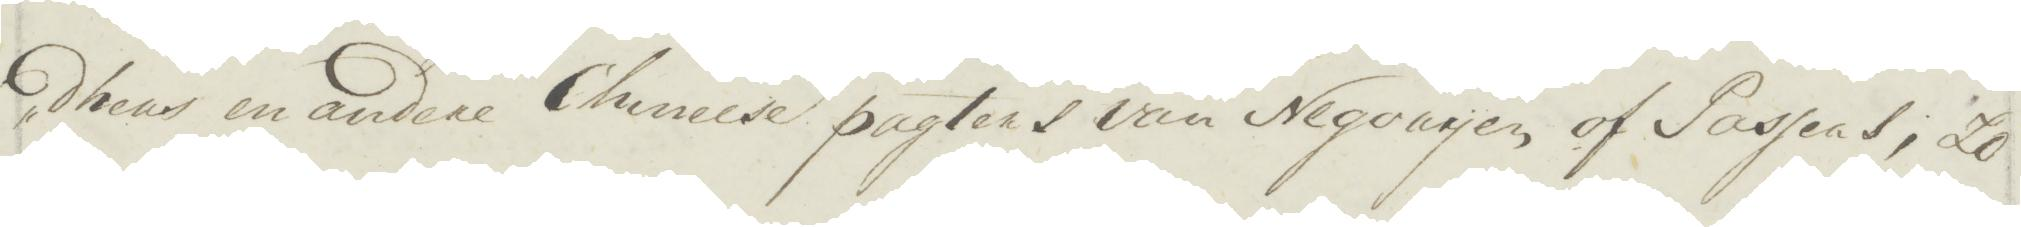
„dhers en andere Chineese pagters van Negorijen of Passers; zo
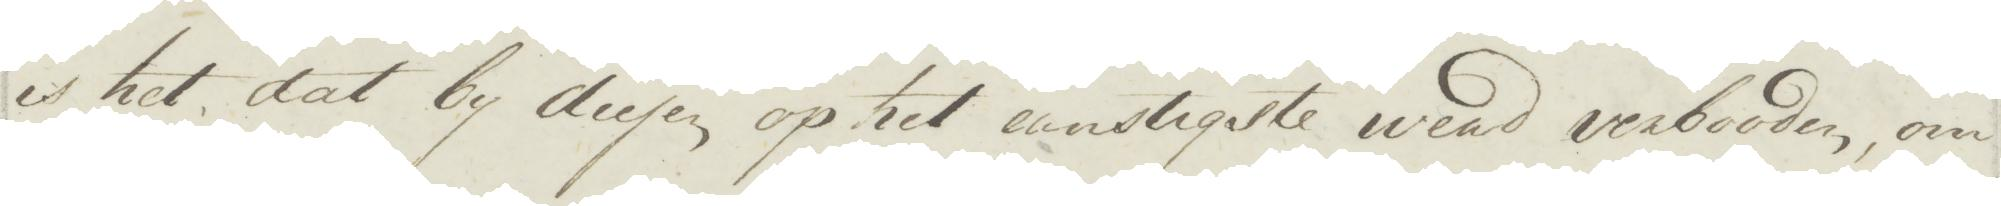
is het dat by deesen op het ernstigste werd verbooden, om
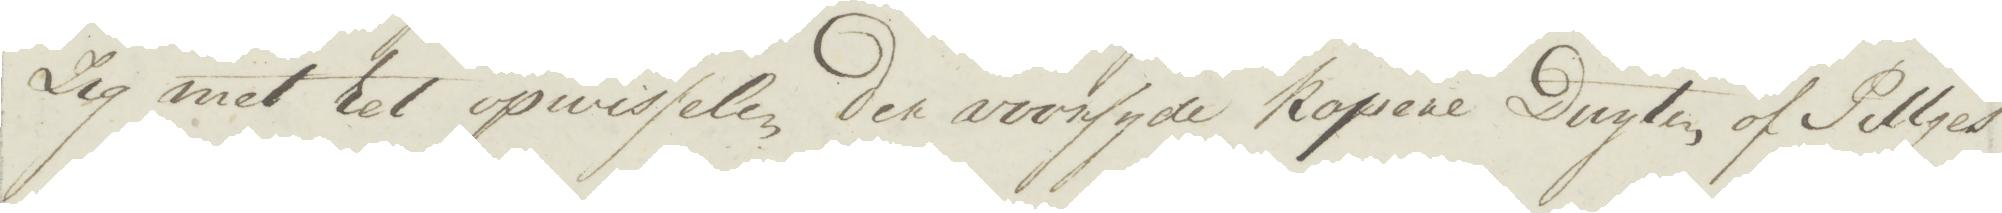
zig met het opwisselen der voorsijde kopere Duijten of Pittjes
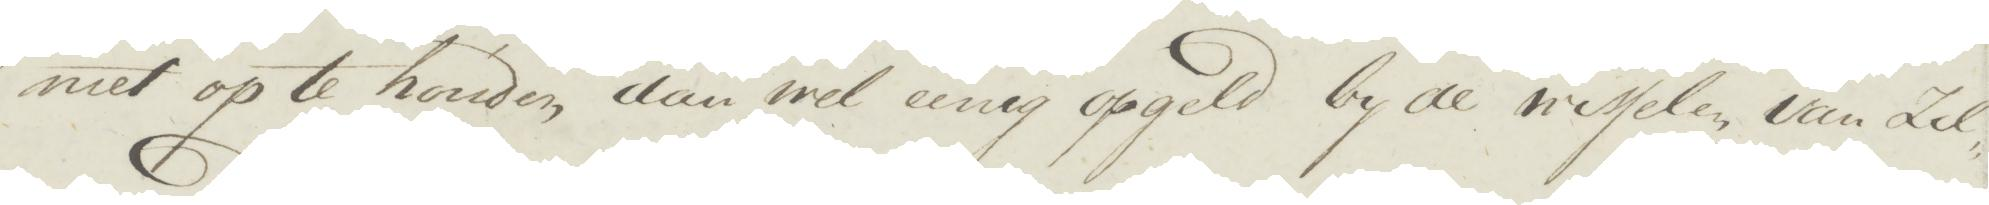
niet op te houden dan wel eenig opgeld bij de wisselen van zil
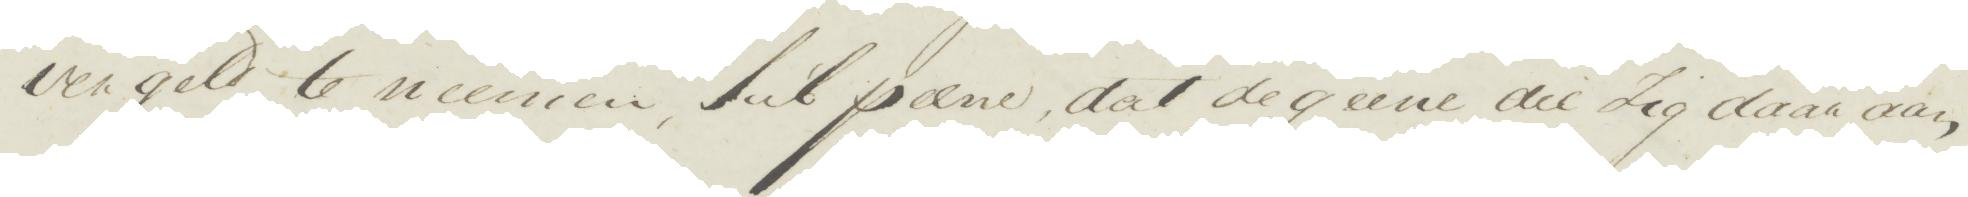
vergeld te neemen, sub poene, dat de geene die zig daar aan
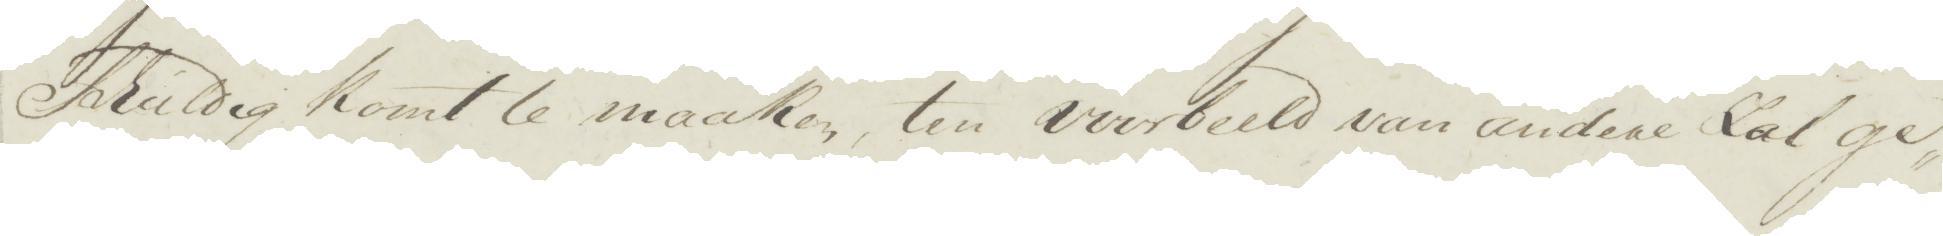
schuldig komt te maaken, ten voorbeeld van andere zal ge„
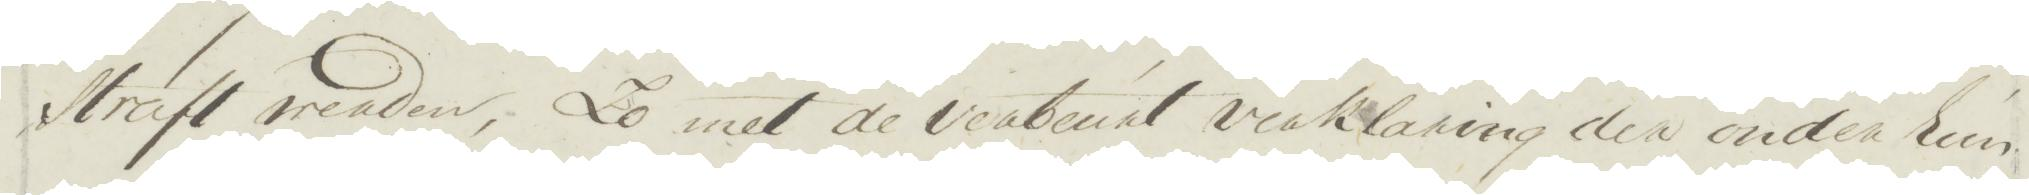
„straft werden, zo met de verbeurt verklaring der onder hun
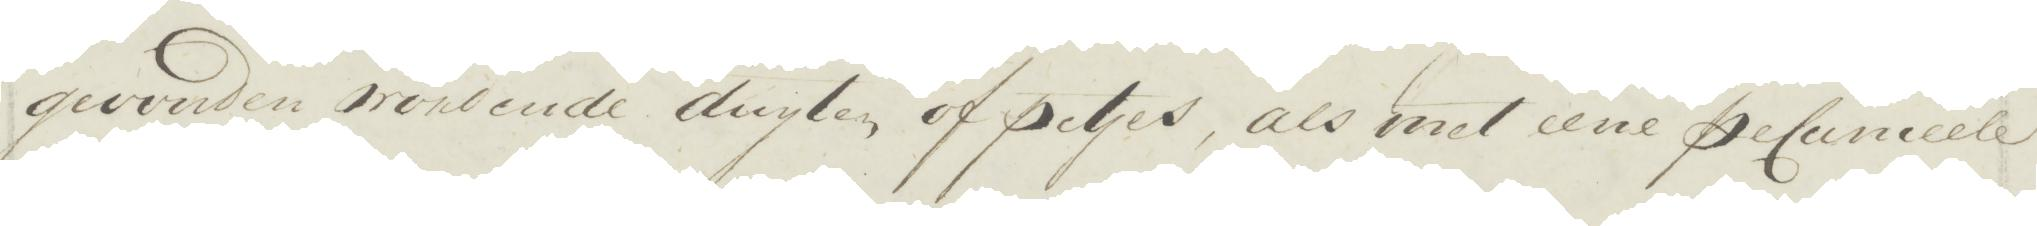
gevonden wordende duijten of pitjes, als met eene Pecunieele
